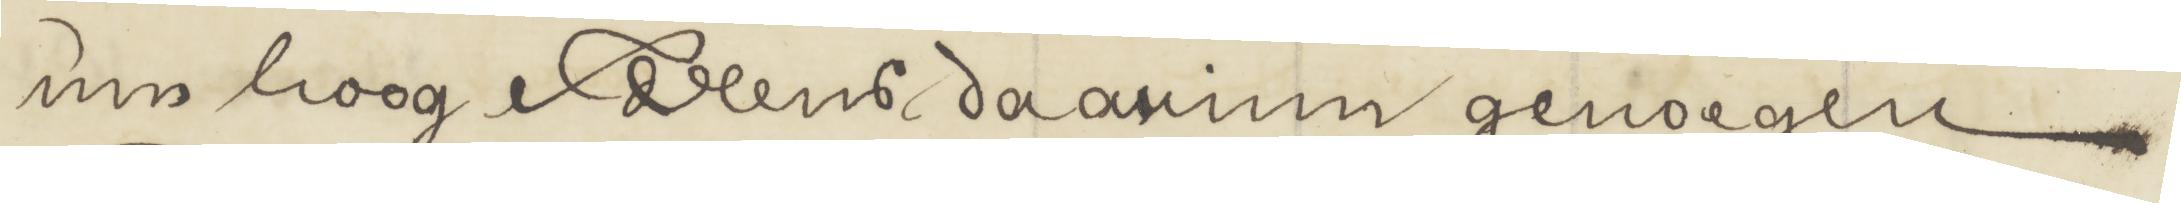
uw hoog Edelens daarinn genoegen
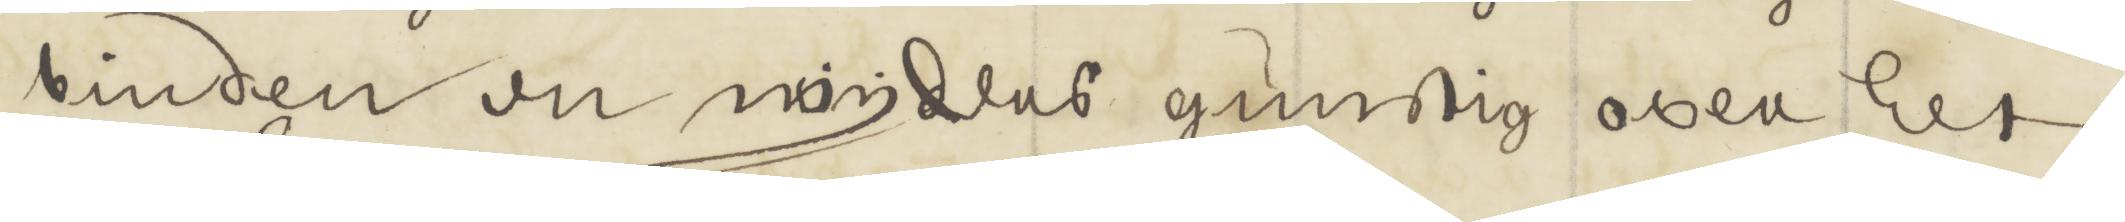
vinden en wijders gunstig over het
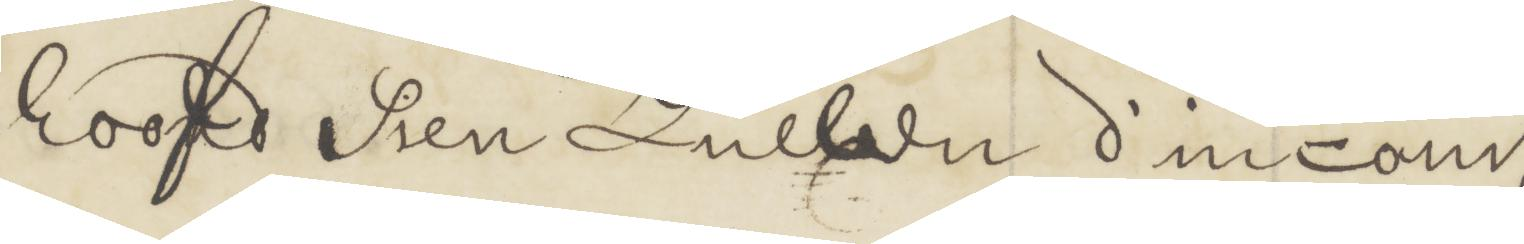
hoofd sien zullen d’incompleetheit der
